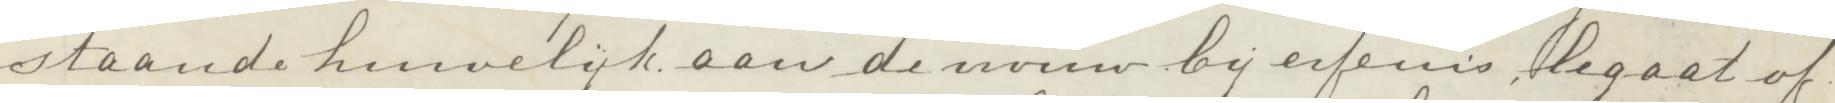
staande huwelijk aan de vrouw bij erfenis, legaat of
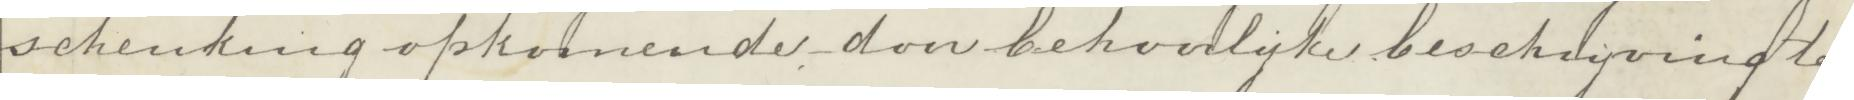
schenking opkomende, door behoorlijke beschrijving te
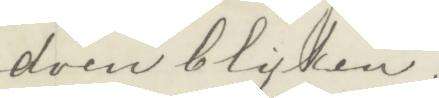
doen blijken.
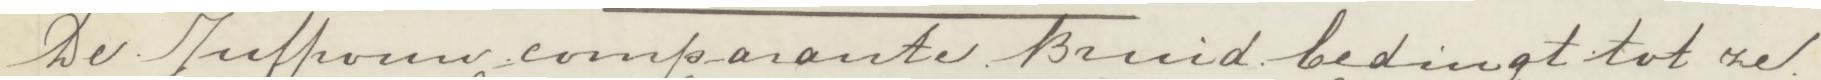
De Juffouw comparante Bruid bedingt tot ze.
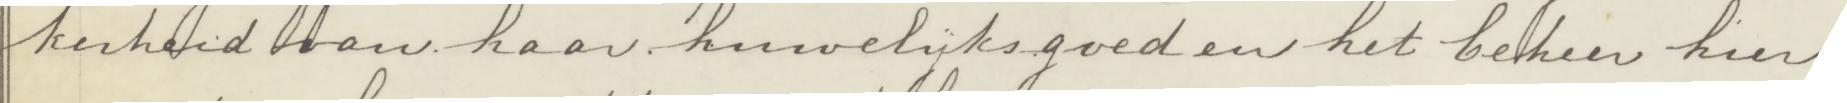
kerheid van haar huwelijks goed en het beheer hier
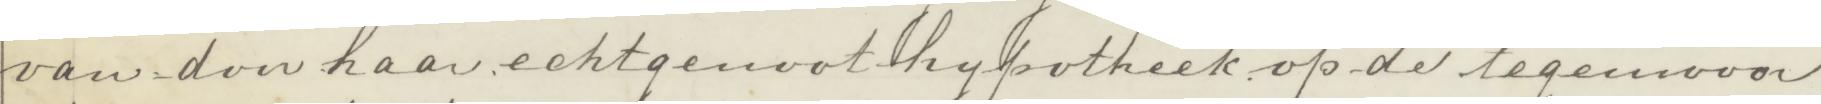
van door haar echtgenoot hypotheek op de tegenwoor
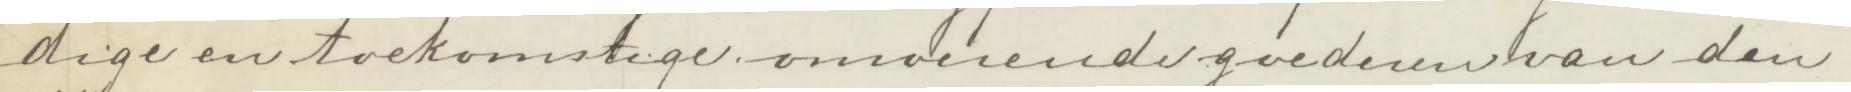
dige en toekomstige, onroerende goederen van den
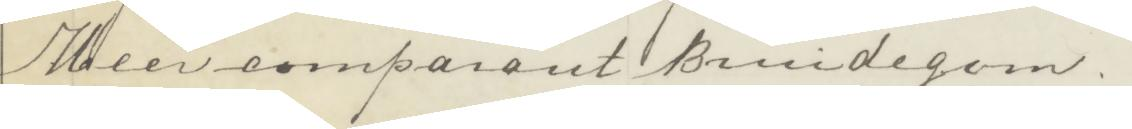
Heer comparant Bruidegom.
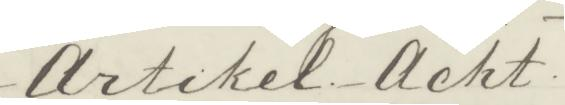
Artikel- Acht
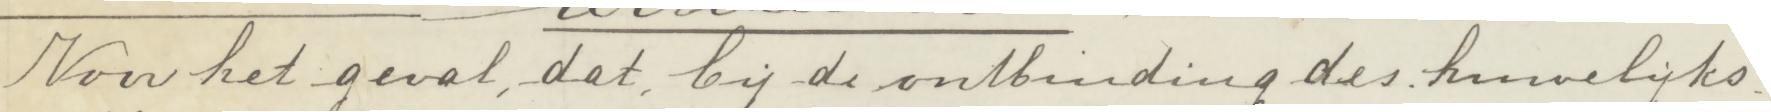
Voor het geval, dat, bij de ontbinding des huwelijks
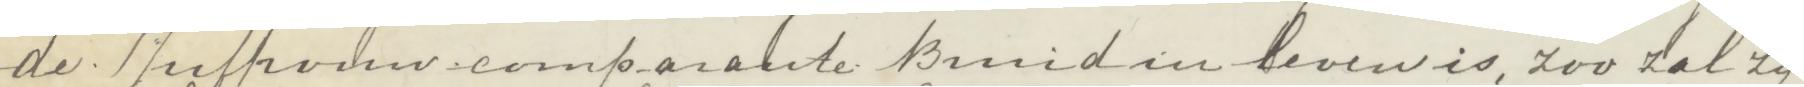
de Juffrouw comparante Bruid in leven is, zoo zal zij
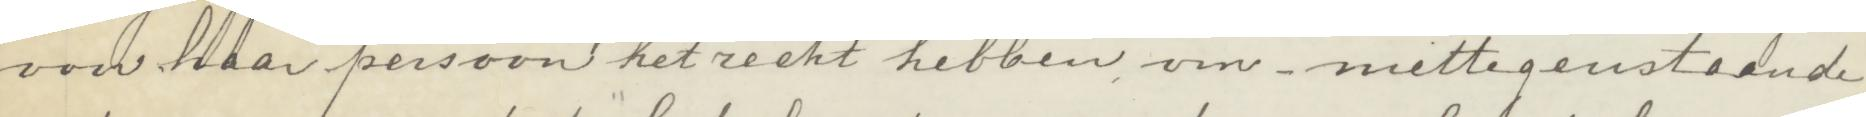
voor haar persoon het recht hebben, om - niettegenstaande
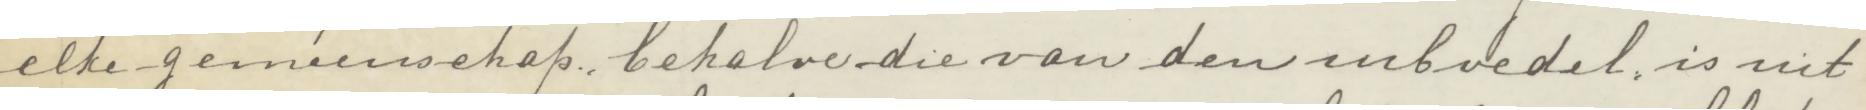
elke gemeenschap, behalve die van den inboedel, is uit
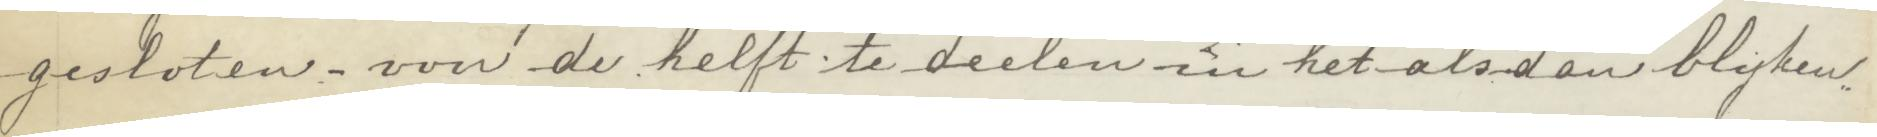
gesloten- voor de helft te deelen in het als dan blijken„
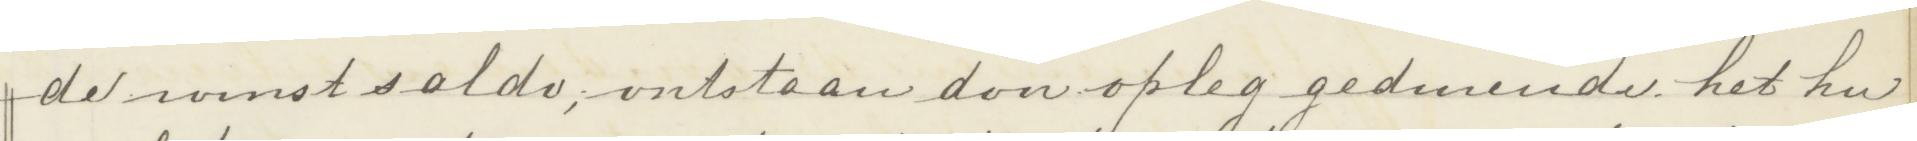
-de winst saldo; ontstaan door opleg gedurende het hu
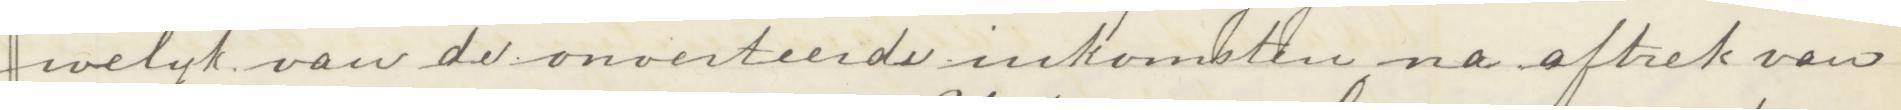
welyk van de onverteerde inkomsten na aftrek van
